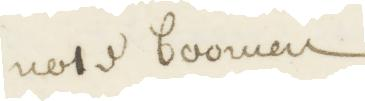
note boomen
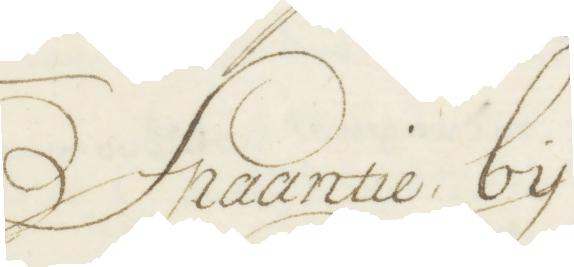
Spaantie, bij
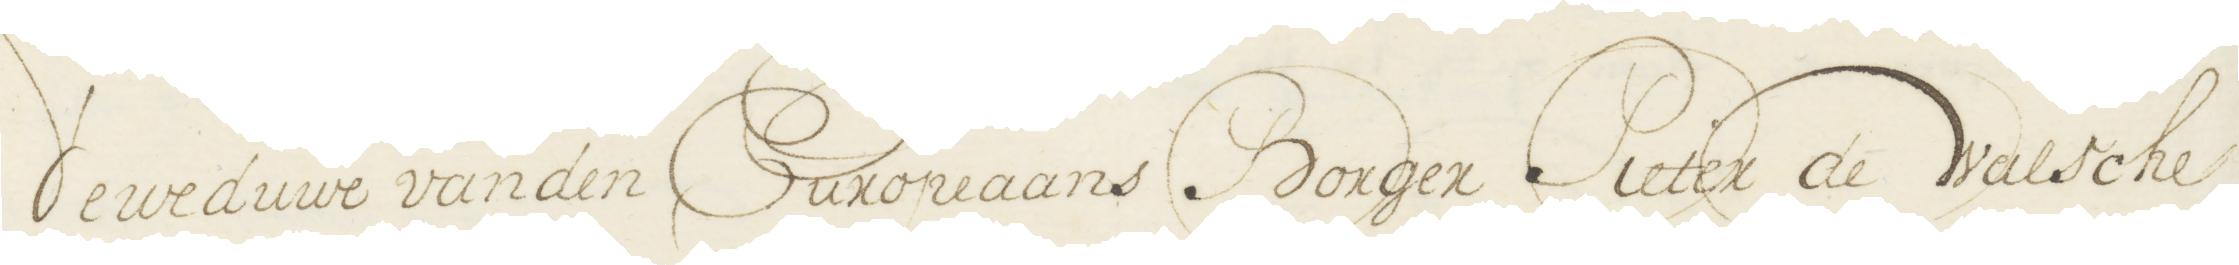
de weduwe van den Europeaans Borger Pieter de Walsche
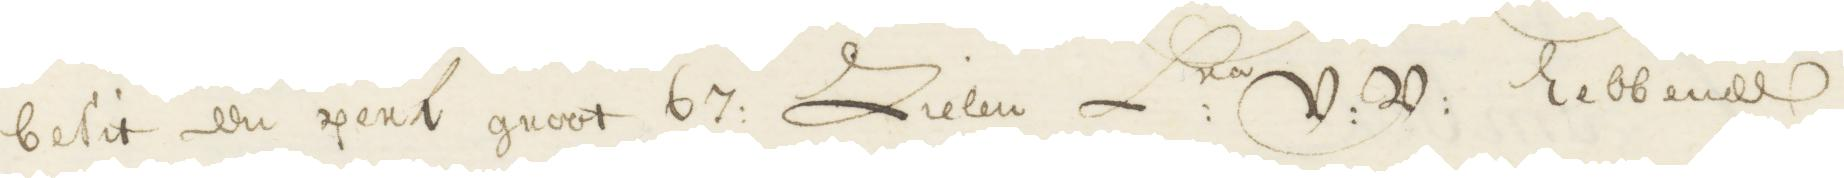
besit een perk groot 67: Zielen L:ra V: V: hebbende
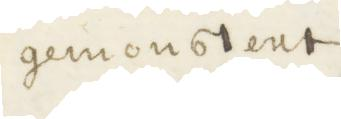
gemonstert
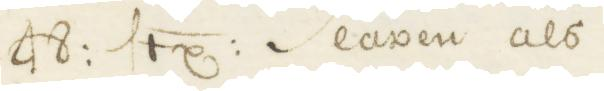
48: stx: Slaven als
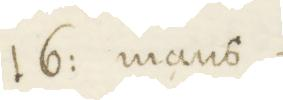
16: mans
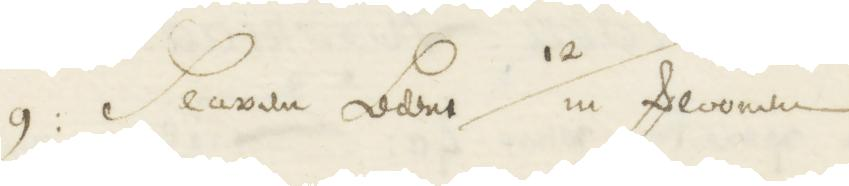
9: Slaven sedert 12/m verlooren
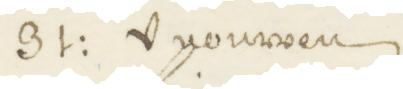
31: vrouwen
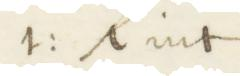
1: kint
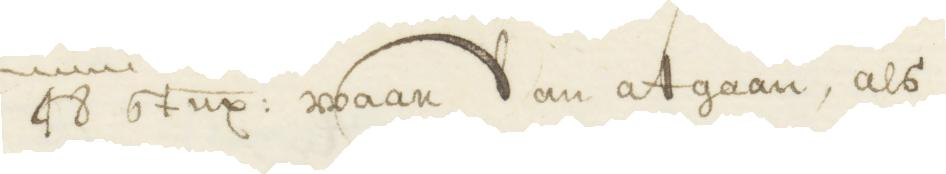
48 stux: waar van afgaan, als
